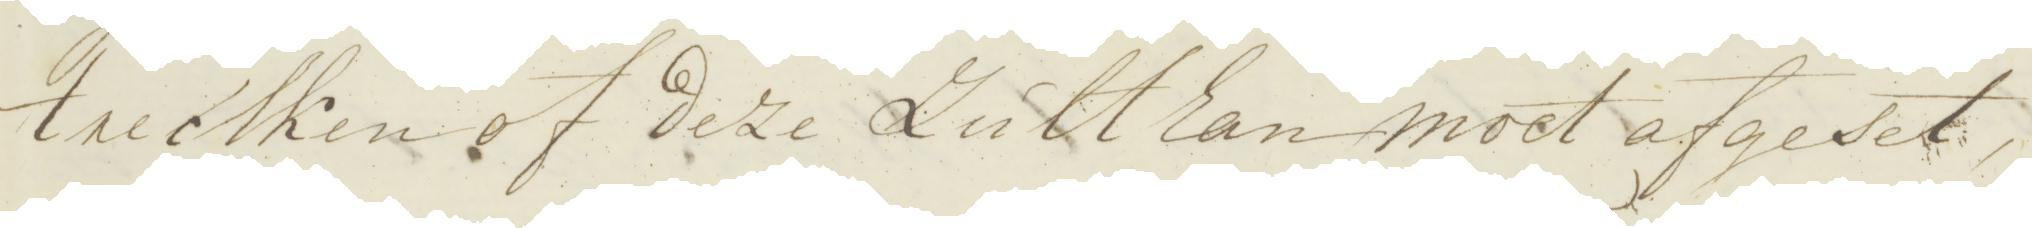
treckken of deze zulthan moet afgeset,
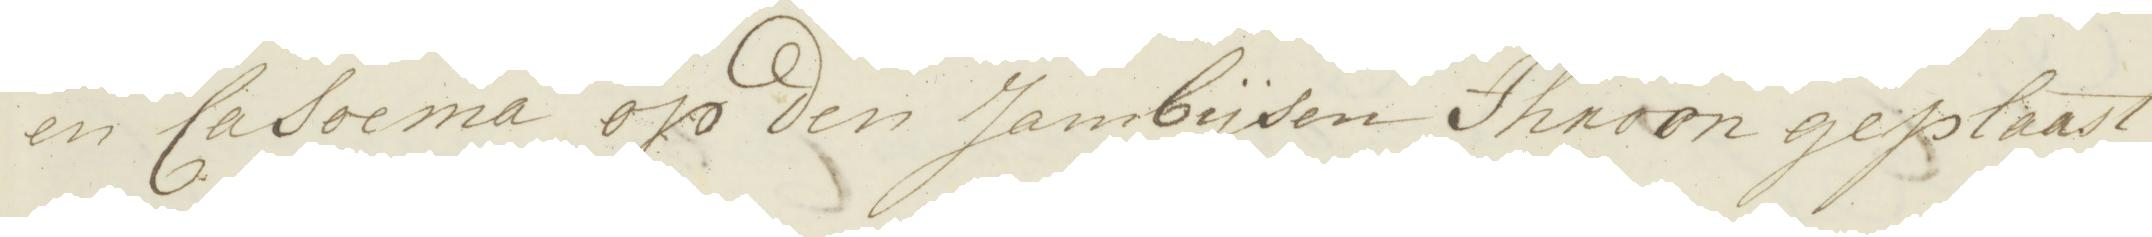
en Casoema op den Jambijsen Throon geplaast
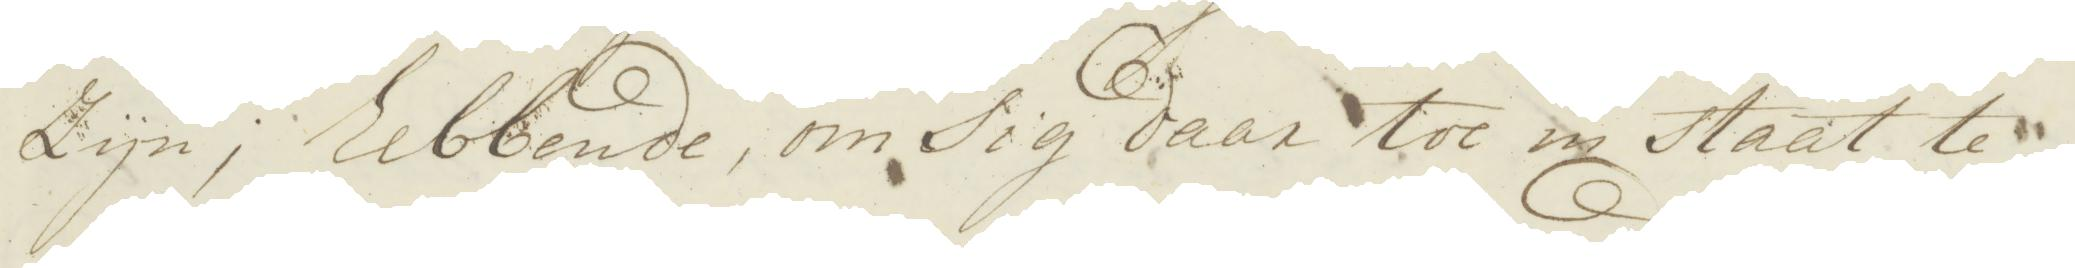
zijn; hebbende, om sig daar tot in staat te
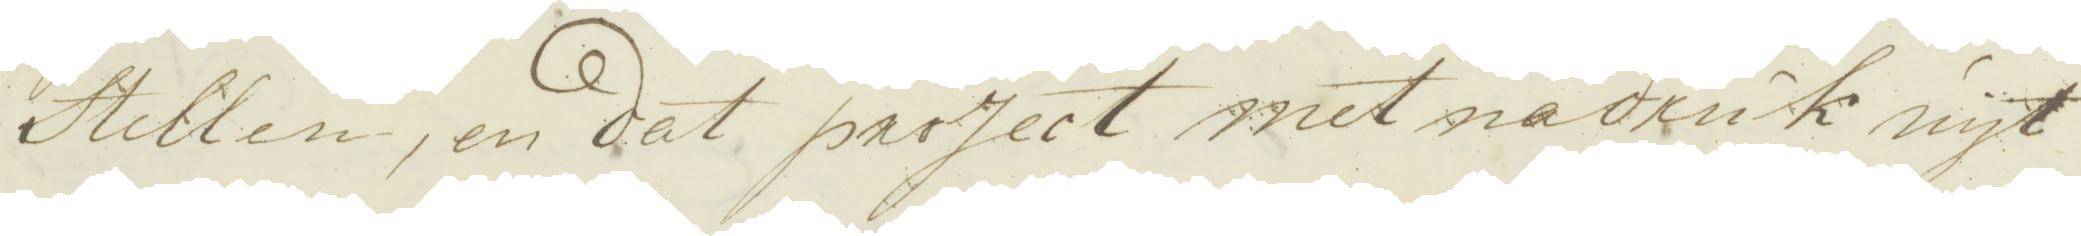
stellen, en dat project met nadruk uijt
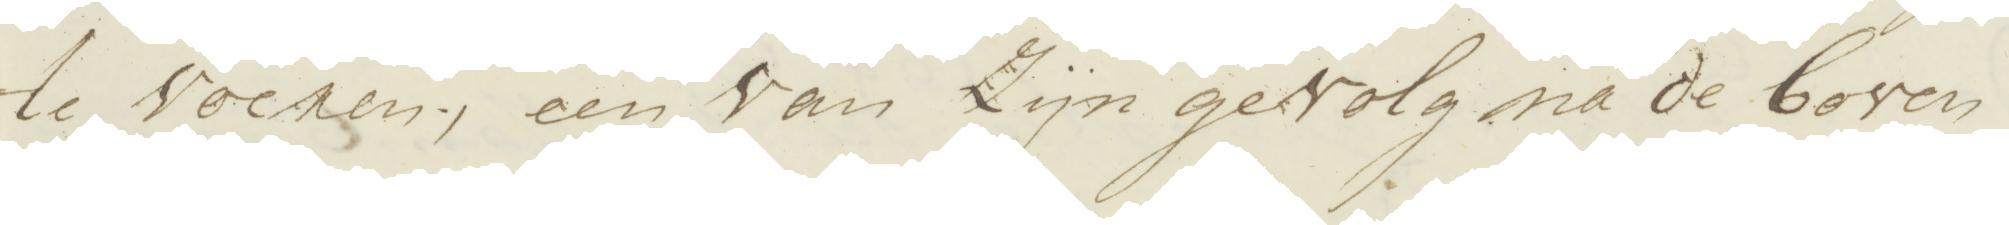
te voeren, een van zijn gevolg na de boven
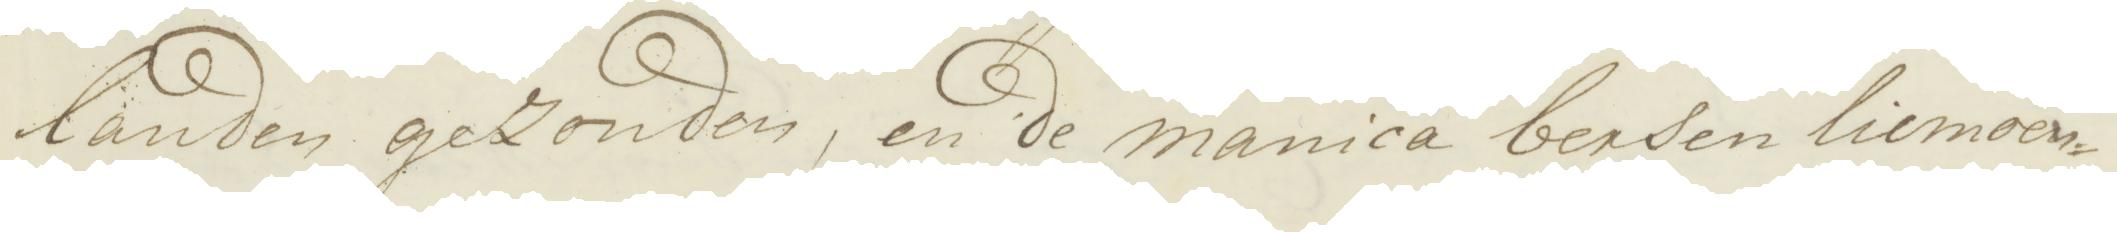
landen gezonden, en de manicabersen liemoen=
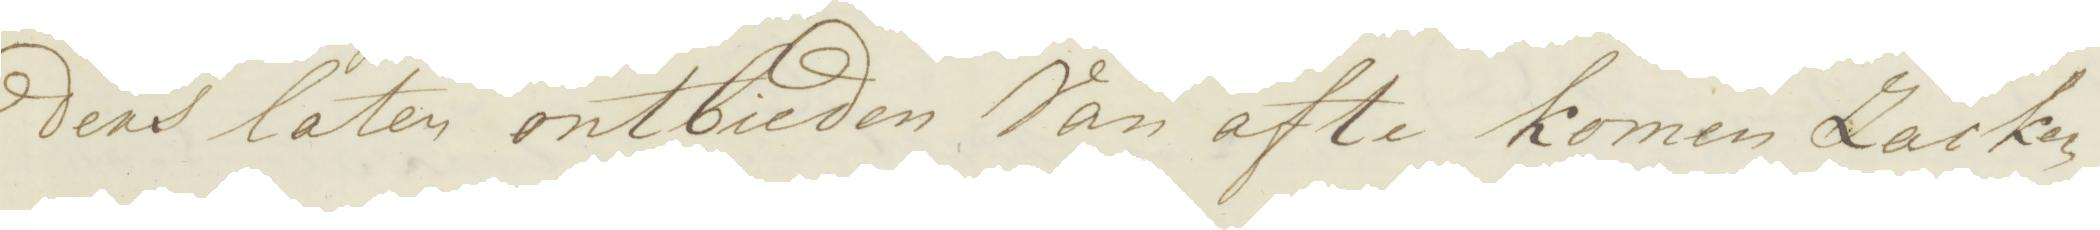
ders laten ontbieden van afte komen zacken
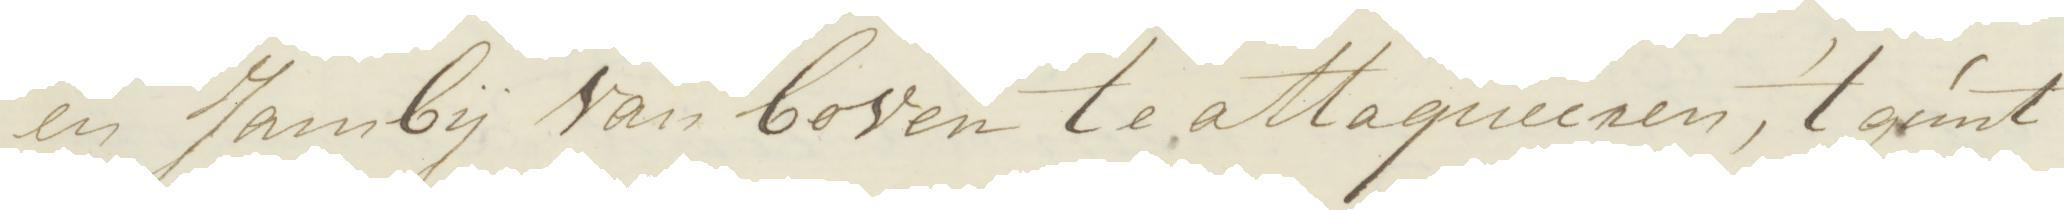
en Jambij van boven te attaqueeren, ’t gunt
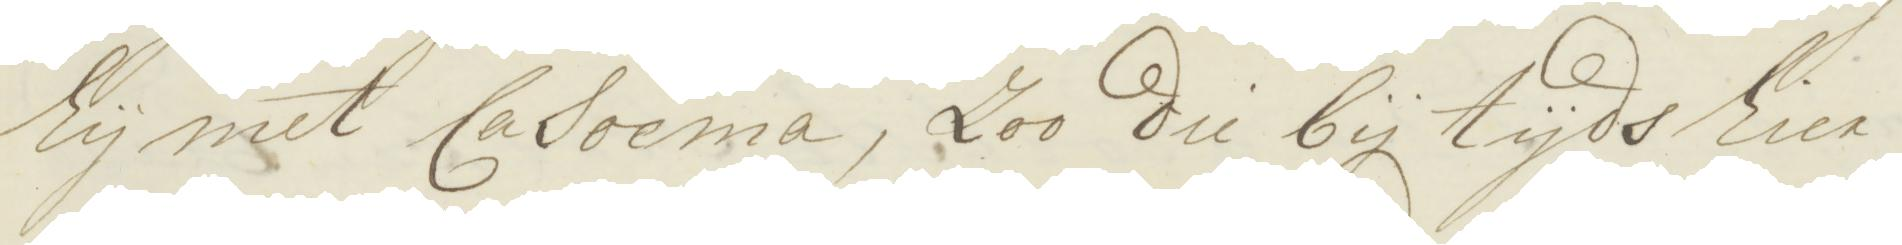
hij met casoema, zoo die bij tijds hier
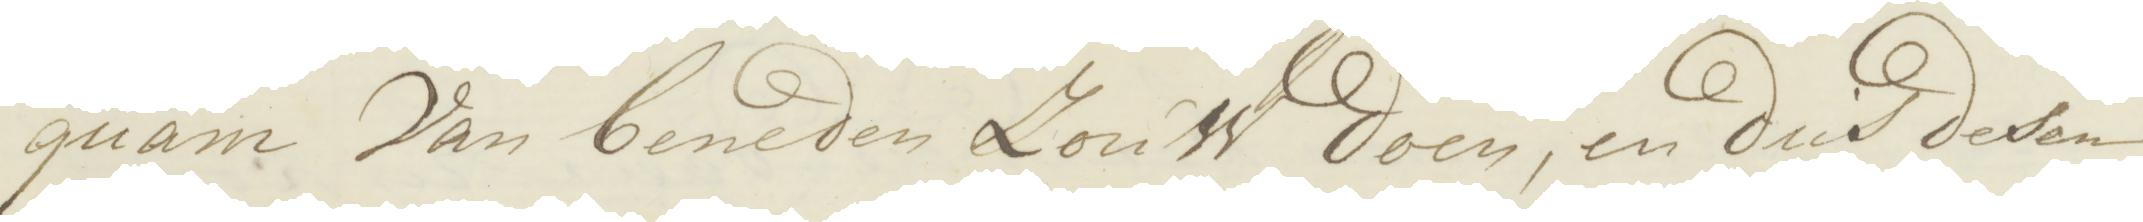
quam van beneden zouw doen, en dus desen
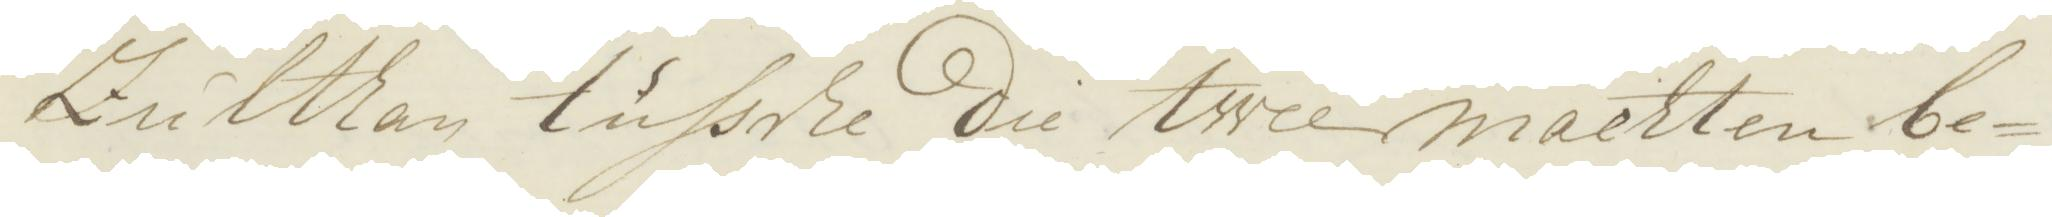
zulthan tussche die twee machten be=
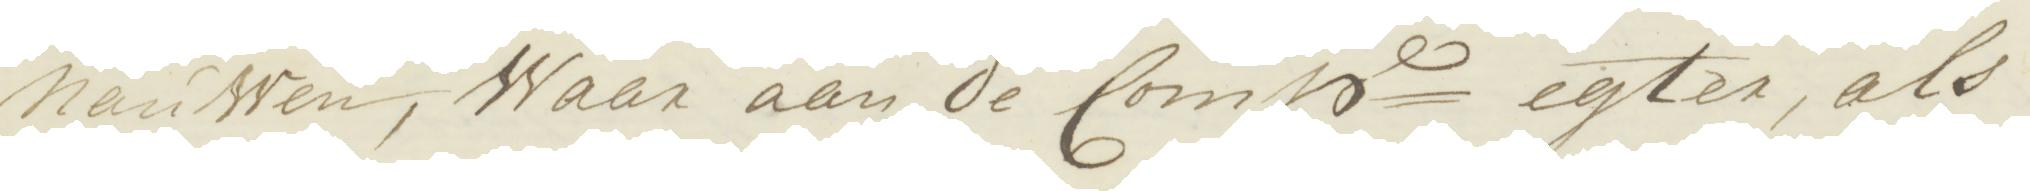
nauwen, waar aan de Comp=e egter, als
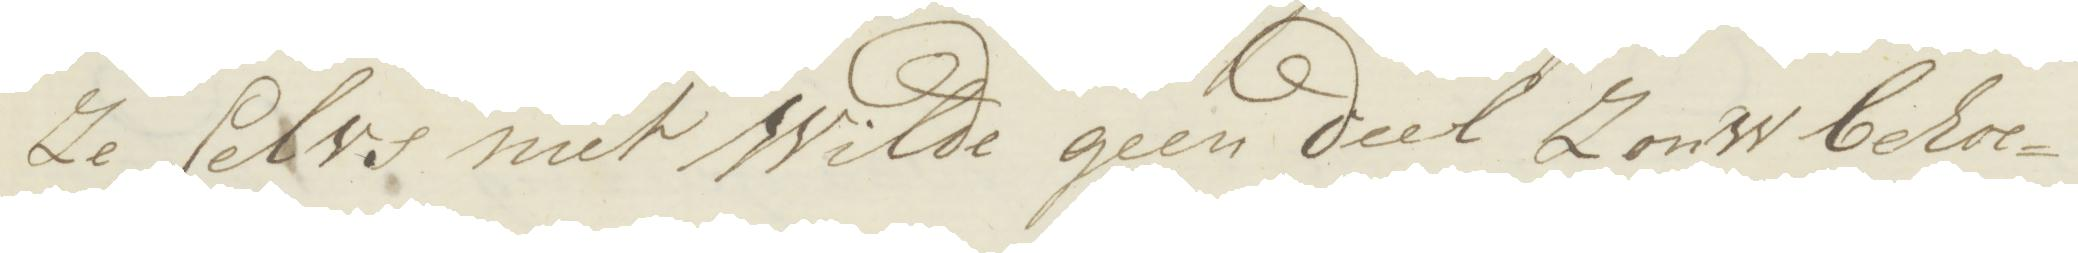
ze selvs niet wilde geen deel zouw behoe=
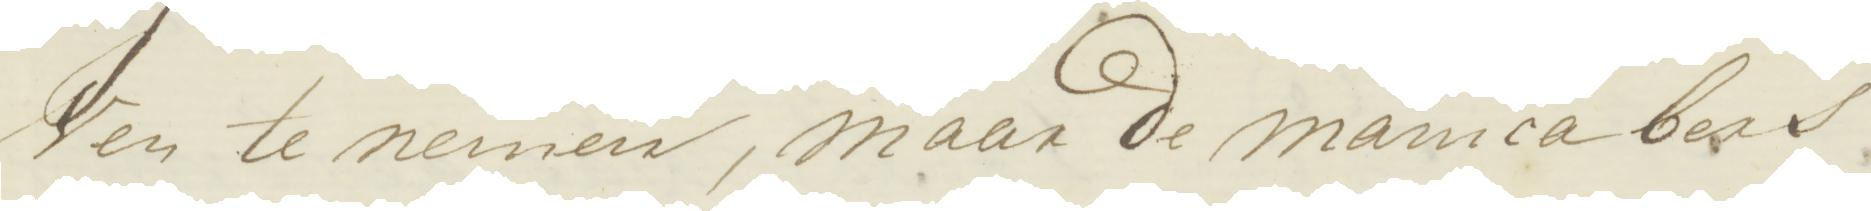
ven te nemen, maar de manicabers
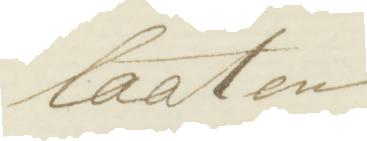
laaten.
